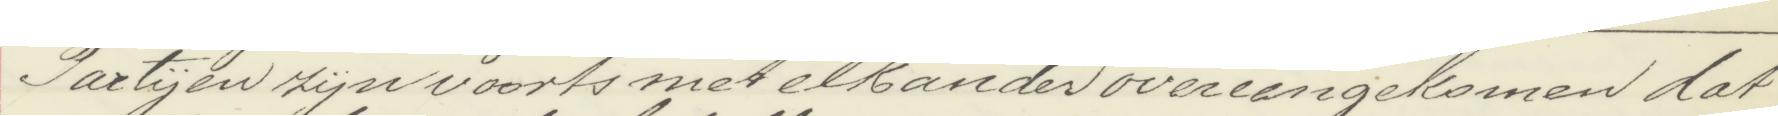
Partijen zijn voorts met elk ander overeengekomen dat
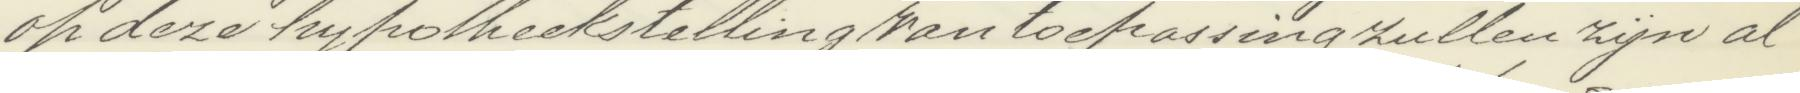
op deze hypotheekstelling van toepassing zullen zijn al
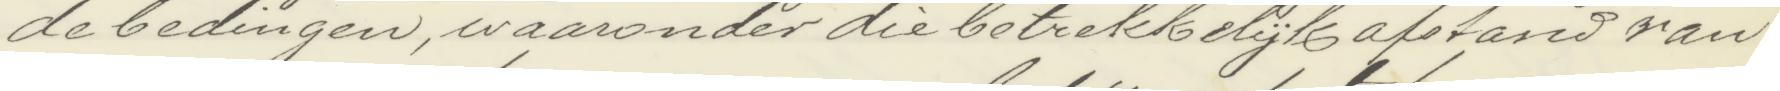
de bedingen, waaronder die betrekkelijk afstand van
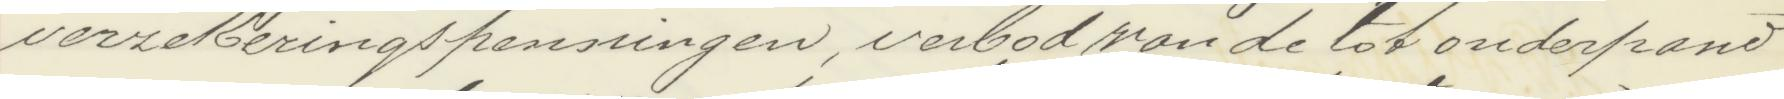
verzekeringspenningen, verbod van de tot onderhand
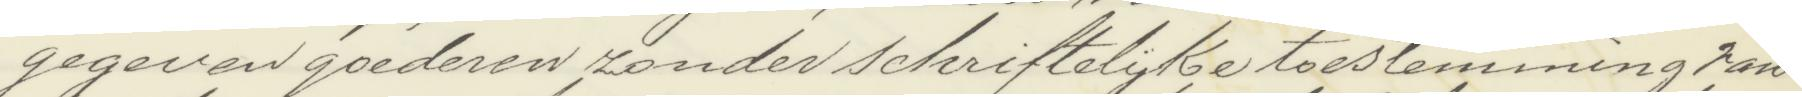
gegeven goederen zonder schriftelijke toestemming van
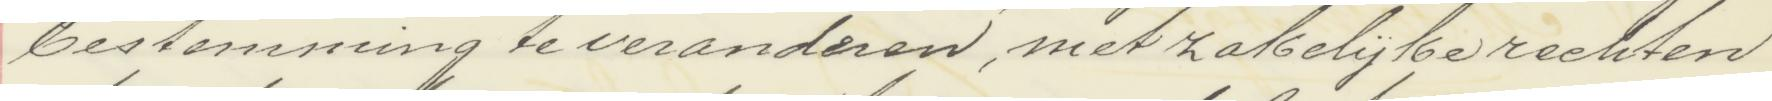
bestemming te veranderen, met zakelijke rechten
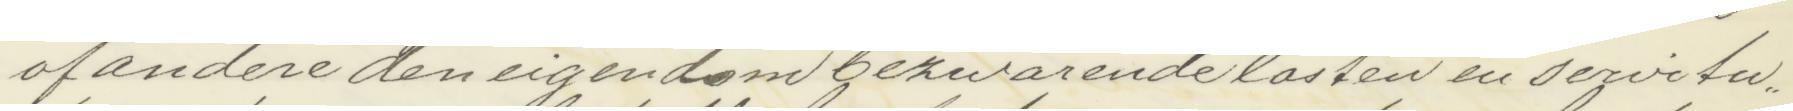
of andere den eigendom bezwarende lasten en servitu„
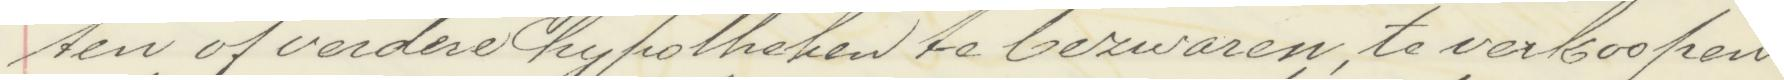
ten of verdere hypotheken te bezwaren, te verkoopen
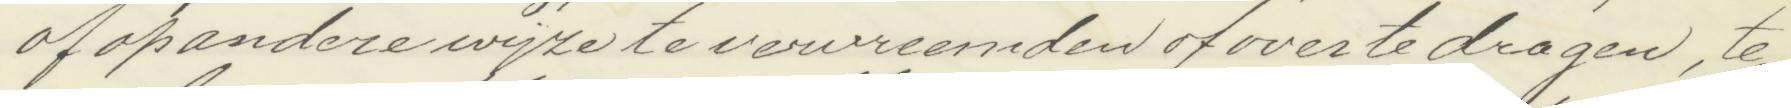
of op andere wijze te vervreemden of over te dragen, te
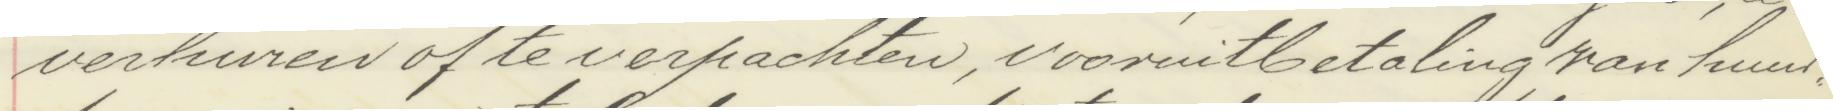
verhuren of te verpachten, vooruitbetaling van huur„
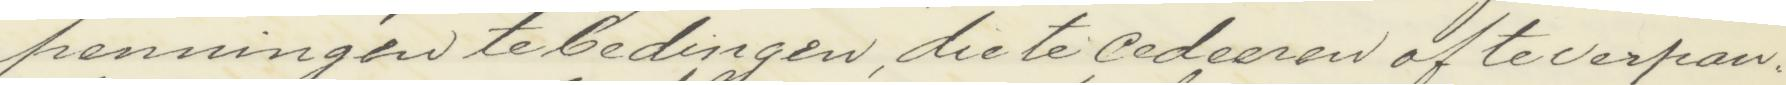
penningen te bedingen, die te cedeeren of te verpan„
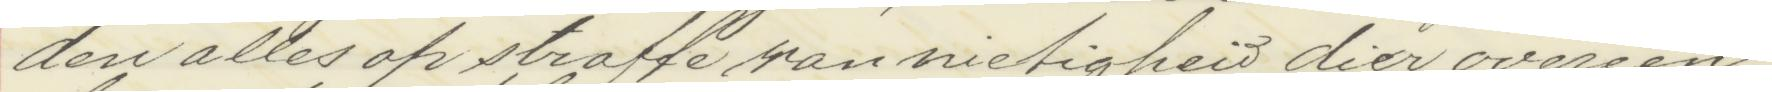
den alles opstraffe van nietigheid dier overeen
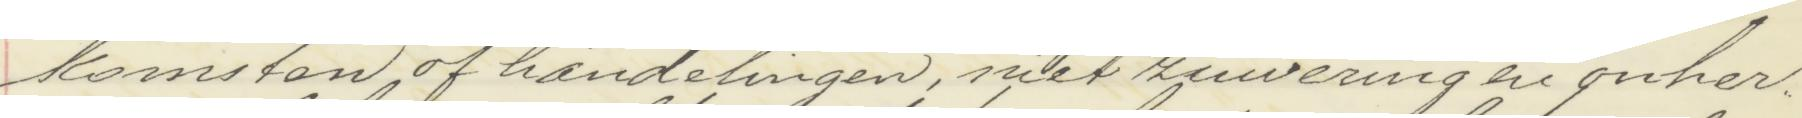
komsten of handelingen, niet zuivering en onher„
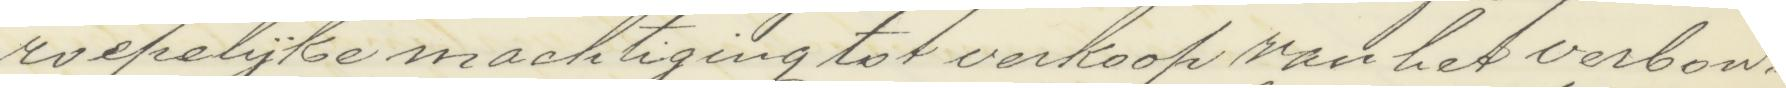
roepelijke machtiging tot verkoop van het verbon„
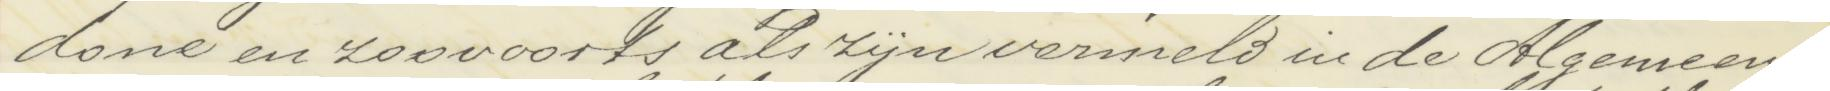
dene en zoovoorts als zijn vermeld in de Algemeene
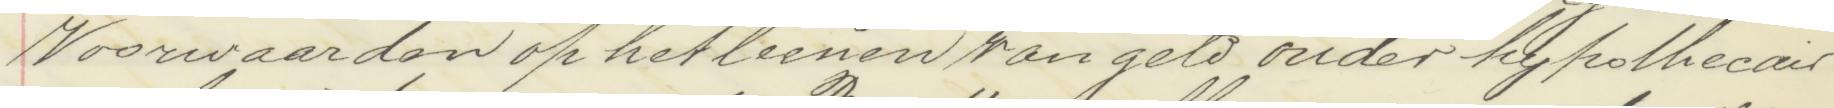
Voorwaarden op het leenen van geld onder hypothecair
